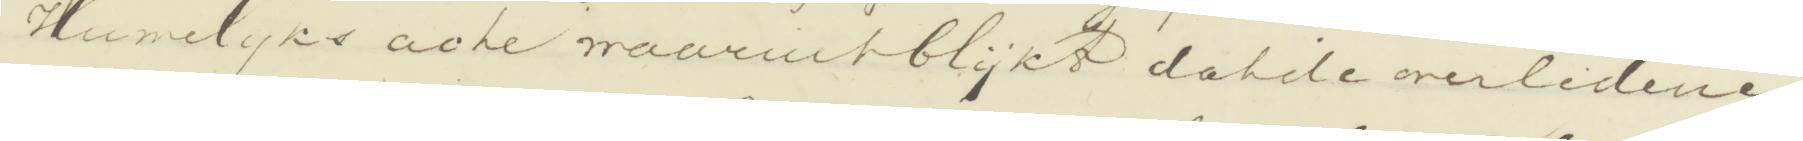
Huwelyks acte waaruit blijkt dat de overledene
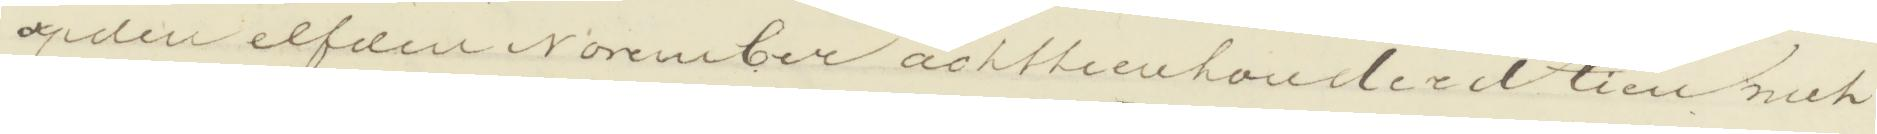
opden elfden November achttienhonderd tien met
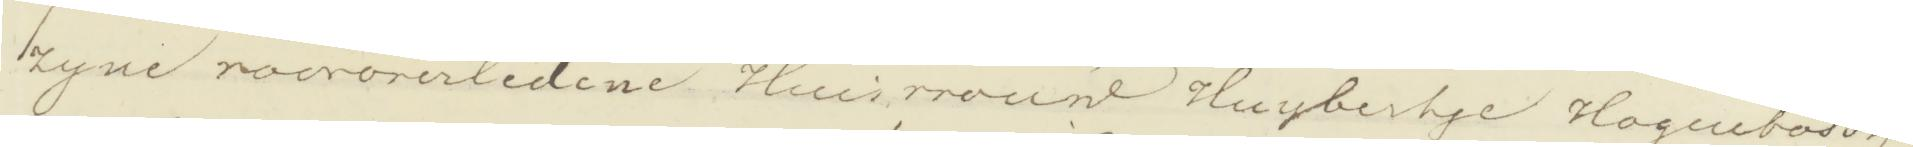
zyne vooroverledene Huisvrouw Huybertje Hogenbosch
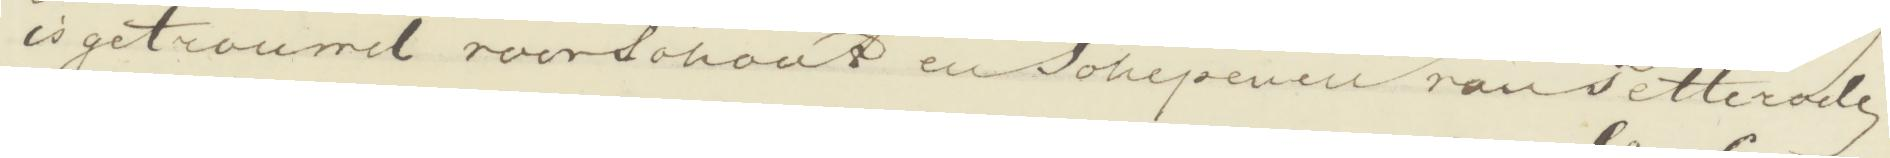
is getrouwd voor schout en schepenen van Tetteroden
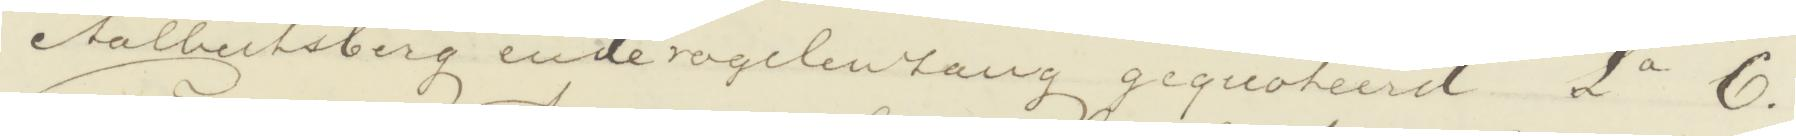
Aalbertsberg en de vogelenzang gequoteerd La C.
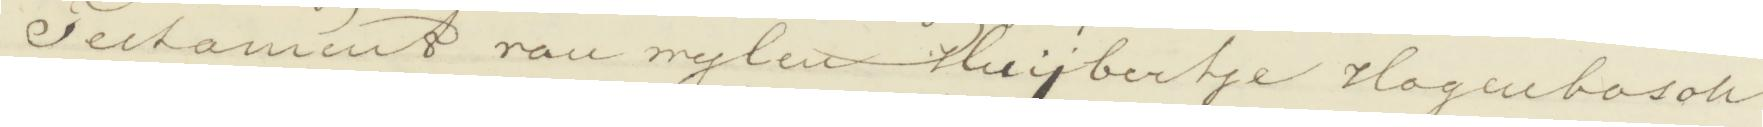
Testament van wylen Huijbertje Hogenbosch
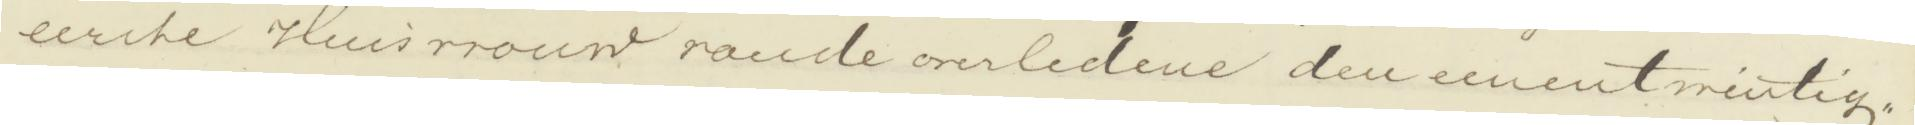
eerste Huisvrouw van de overledene den een en twintig„
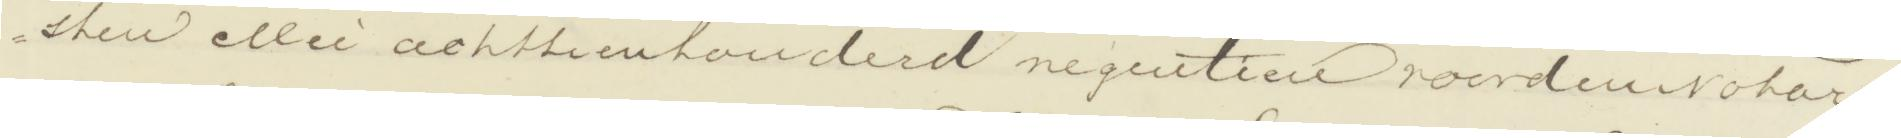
=sten Mei achttienhonderd negentien voor den Notaris
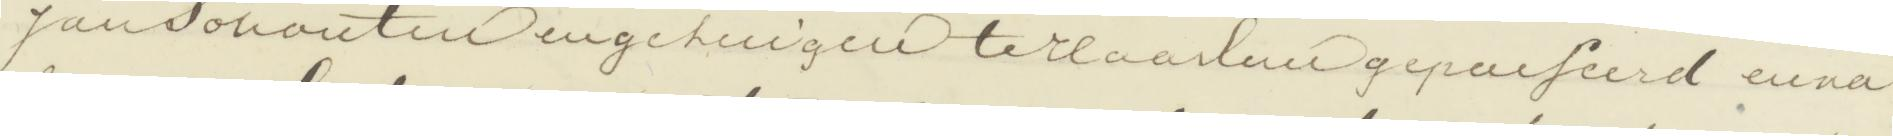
Jan Schouten en getuigen te Haarlem gepasseerd en na
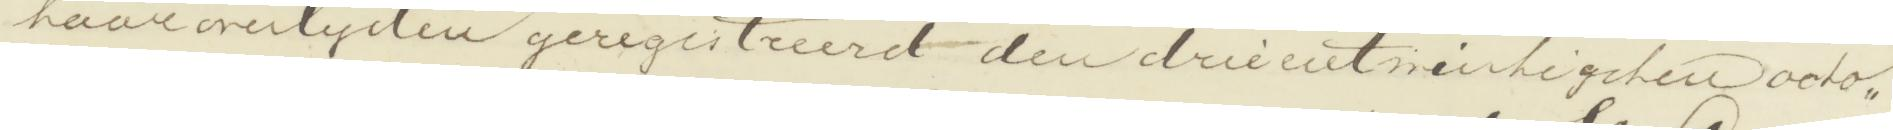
haar overlyden geregistreerd den drie en twintigsten octo„
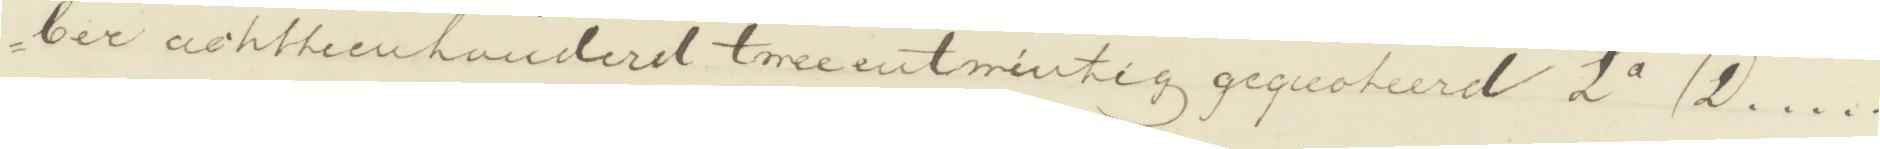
=ber achttienhonderd twee en twintig gequoteerd La D . . . . .
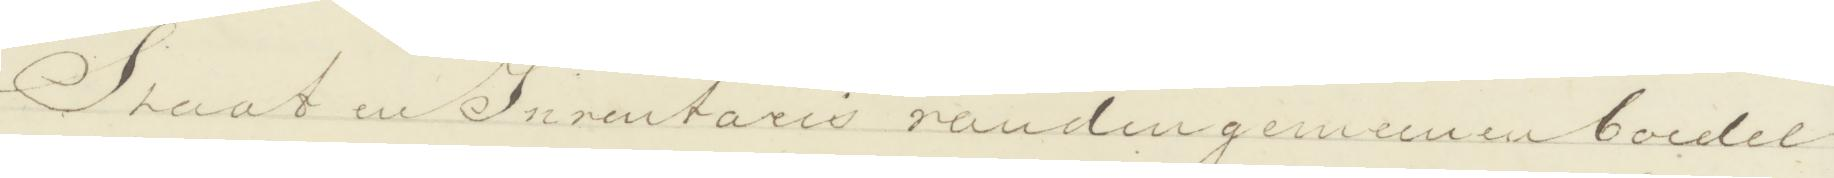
Staat en Jnventaris van den gemeenen boedel
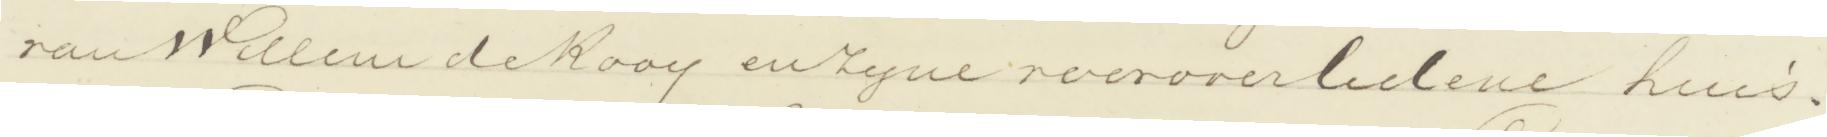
van Willem de Rooy en zyne vooroverleedene huis„
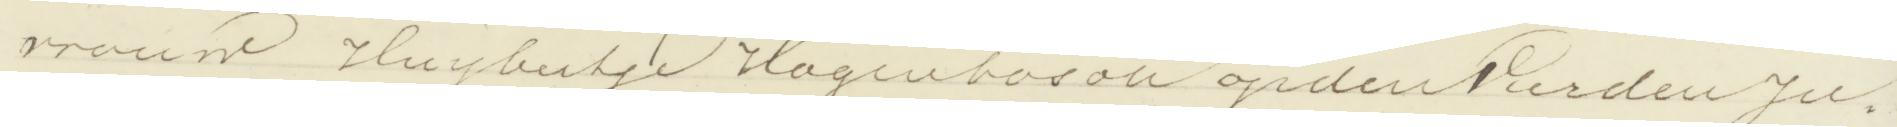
vrouw Huybertje Hogenbosch op den Vierden Ju„
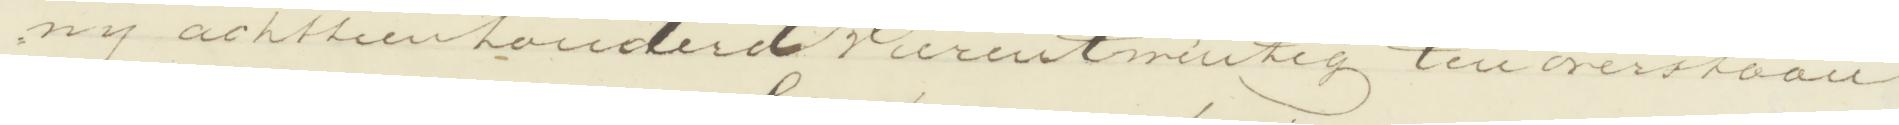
„ny achttienhonderd Vierentwintig ten overstaan
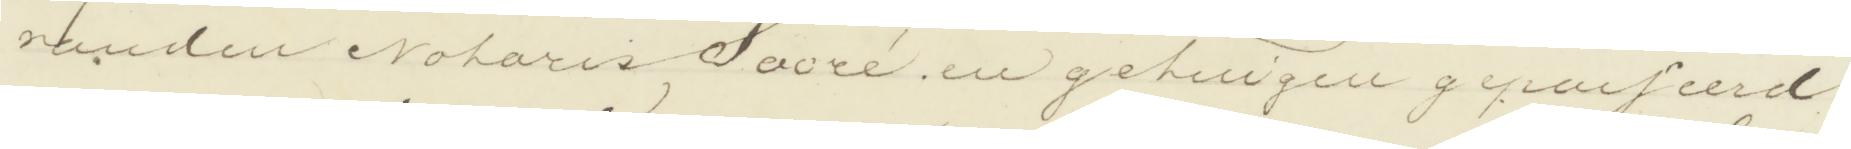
vanden Notaris Saoré, en getuigen gepasseerd
